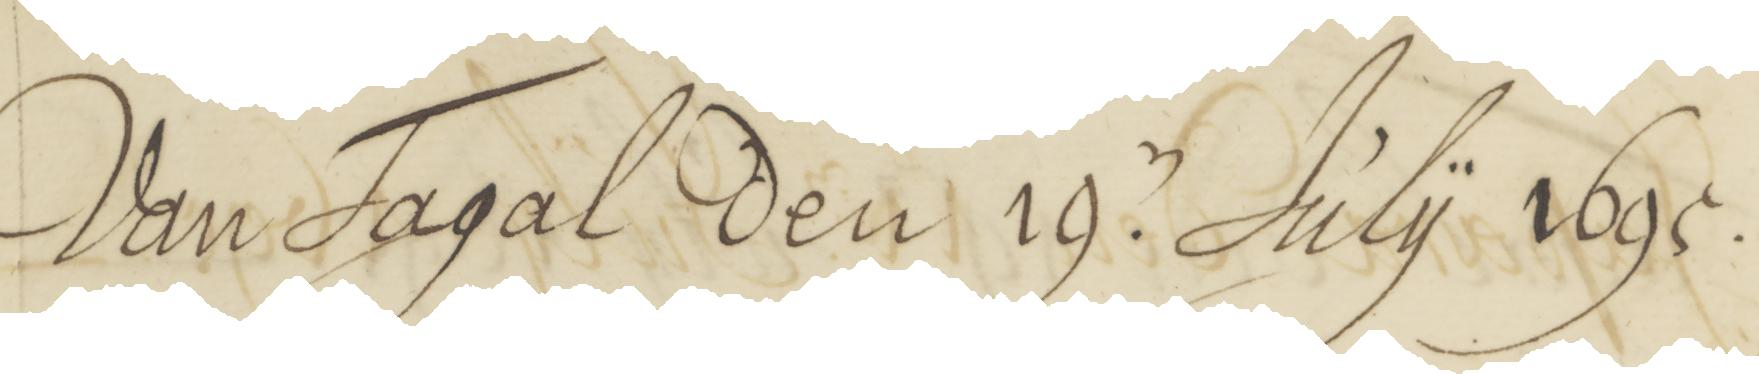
Van Tagal den 19.n Julij 1695.
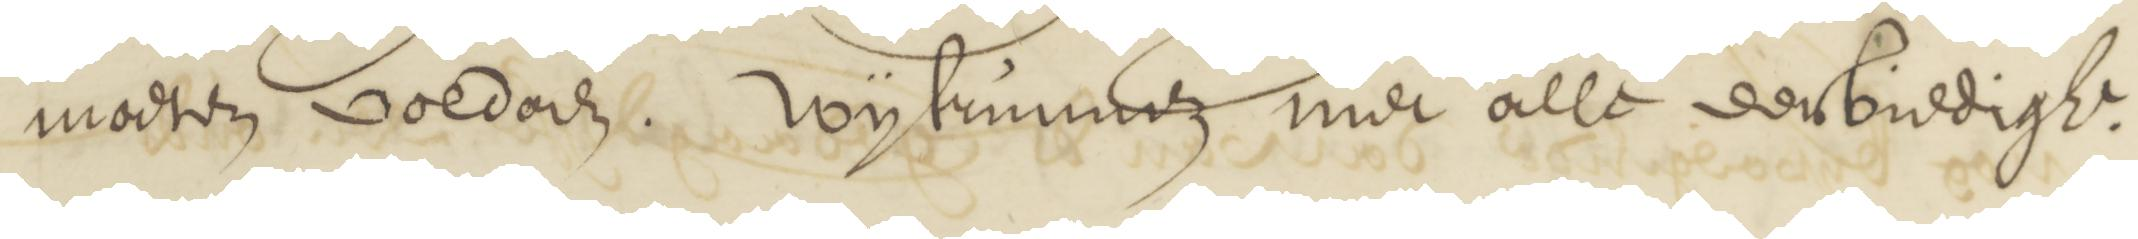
moeten voldoen. wij kunnen met alle eerbiedigh.t
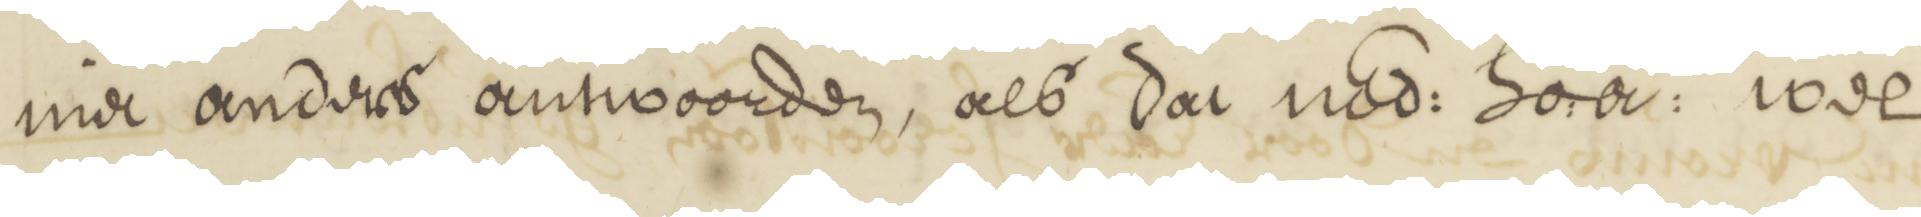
niet anders antwoorden, als dat uEd: ho:a: wel
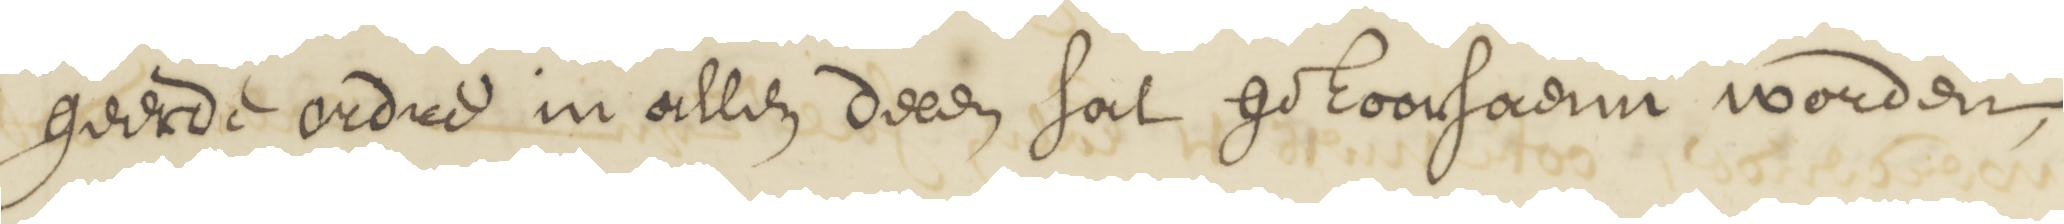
g'eerde ordre in allen delen sal gehoorsaemt worden,
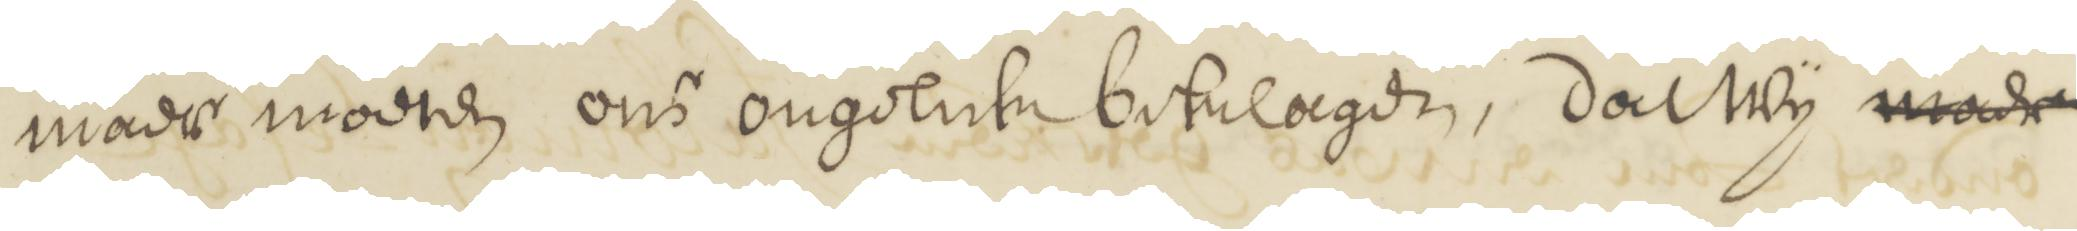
maer moeten ons ongeluk beklagen, dat wij
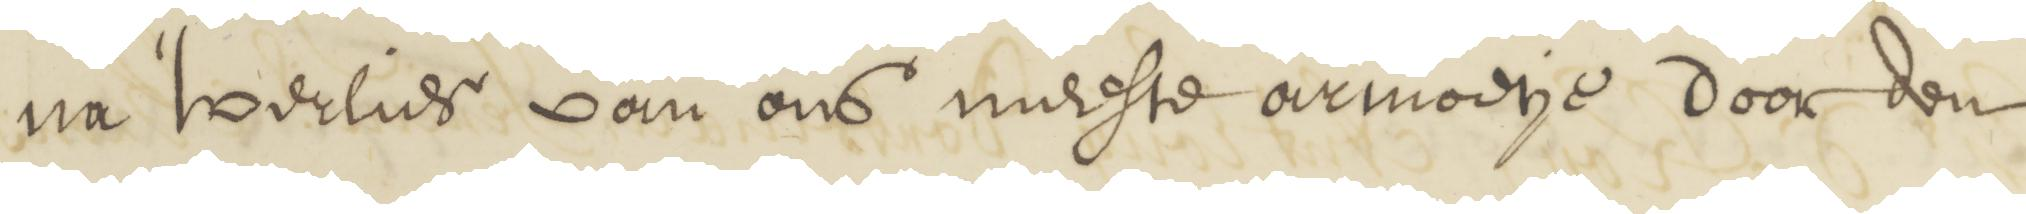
na 'tverlies van ons meeste armoetje door den
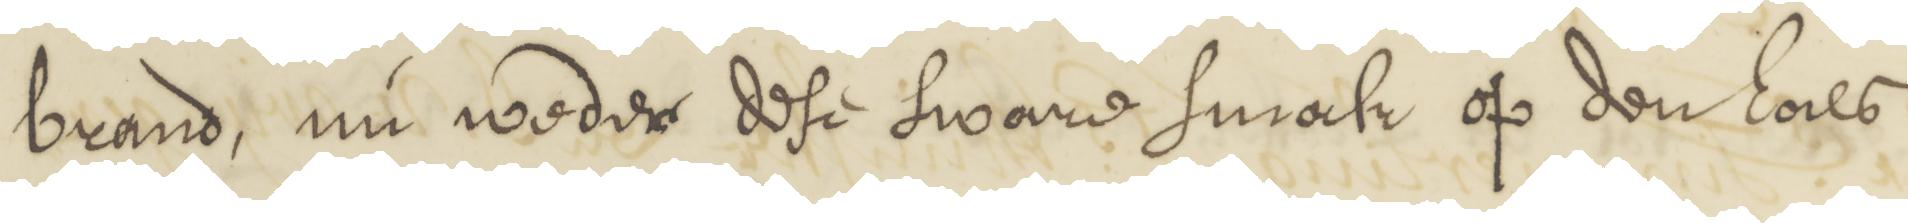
brand, nu weder dese sware smak op den hals
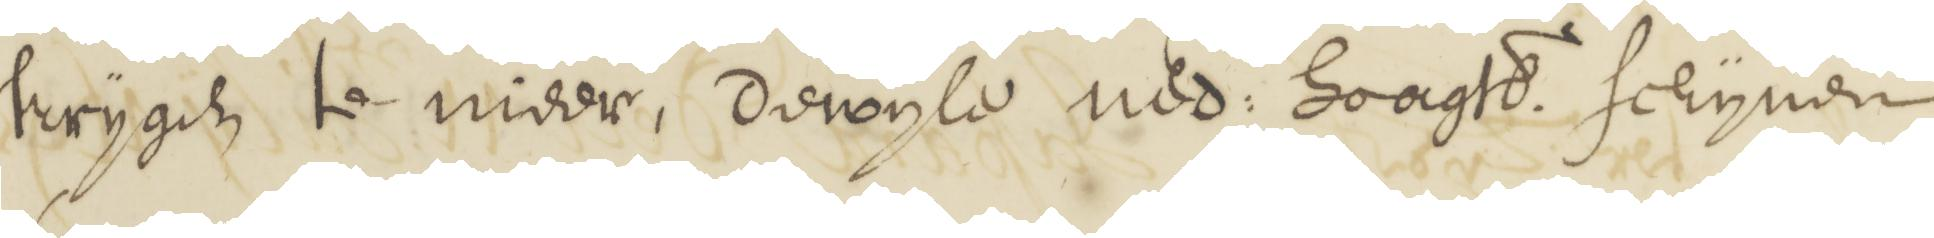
krijgen te nieer, dewijle uEd: hoagtb. schijnen
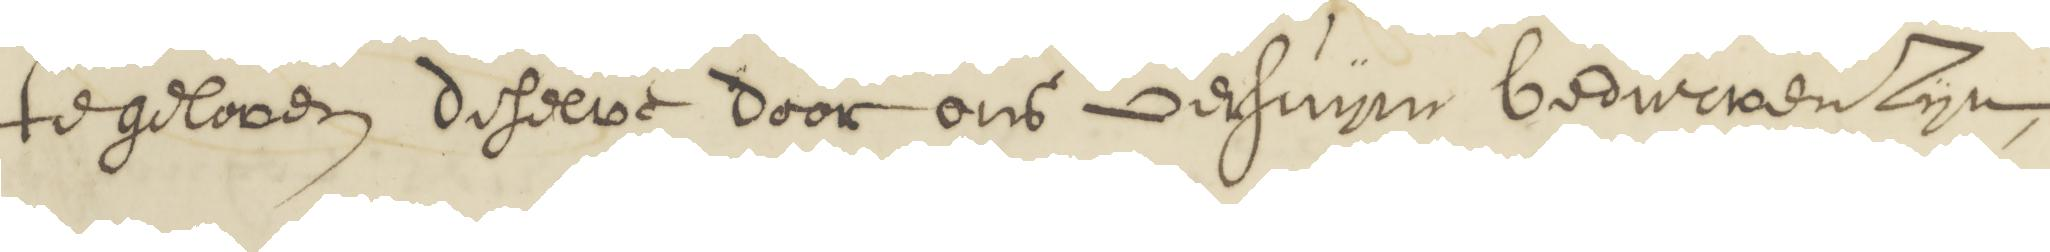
te geloven deselve door ons versuijm bedurven zijn,
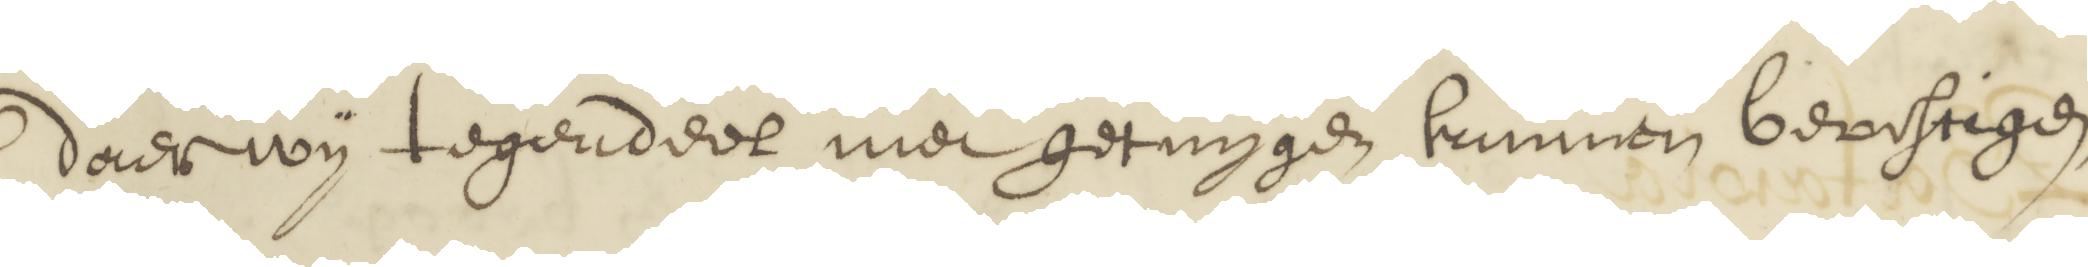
daer wij tegendeel met getuijgen kunnen bevestigen,
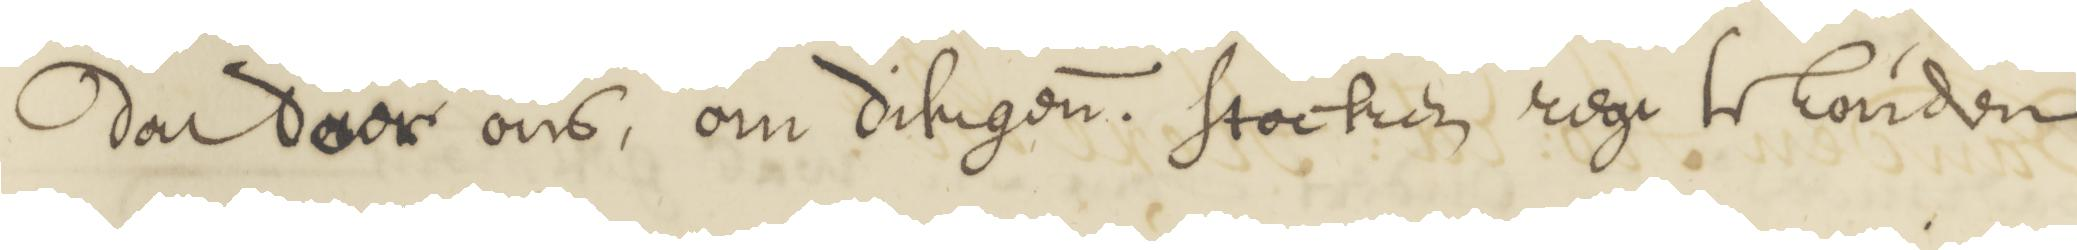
dat daer ons, om dikgen. stocken regt te houden
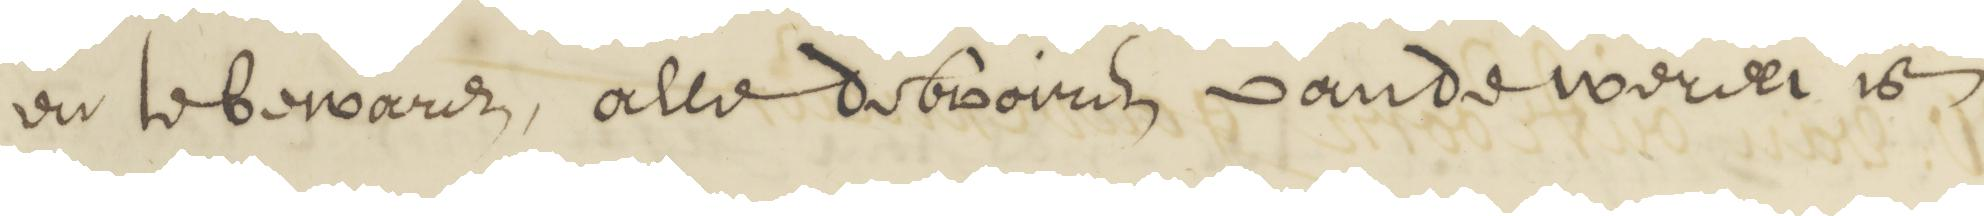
en te bewaren, alle debvoiren vande werelt is
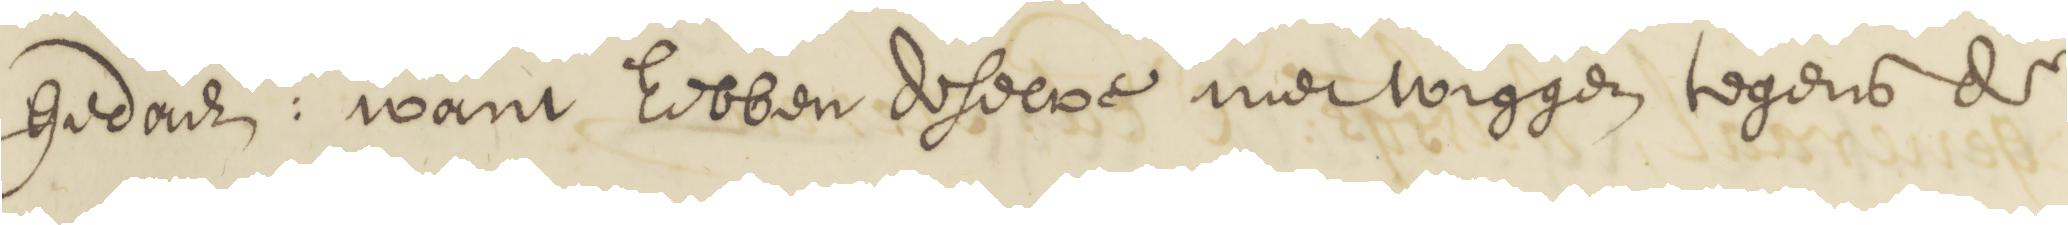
gedaen: want hebben deselve met wiggen tegens de
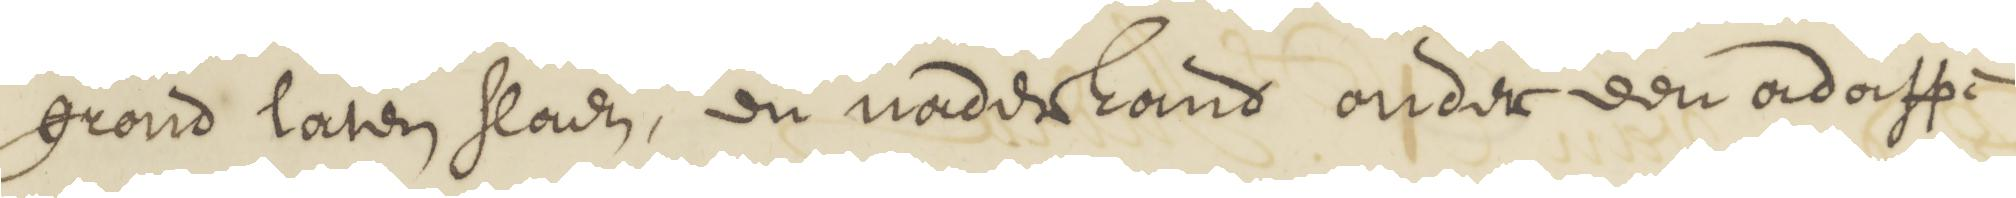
grond laten slaen, en naderhand onder een adappe
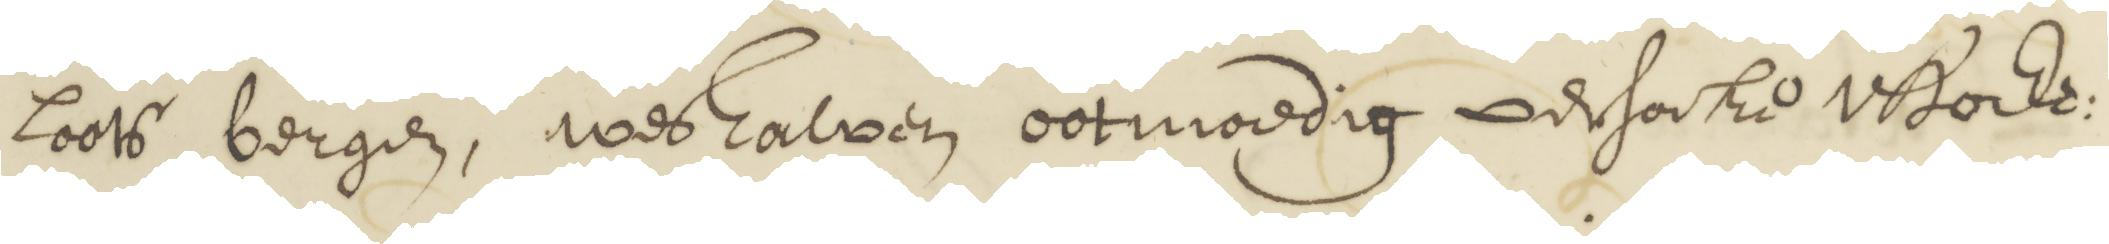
loots bergen, weshalven ootmoedig versoeke VHoEd:
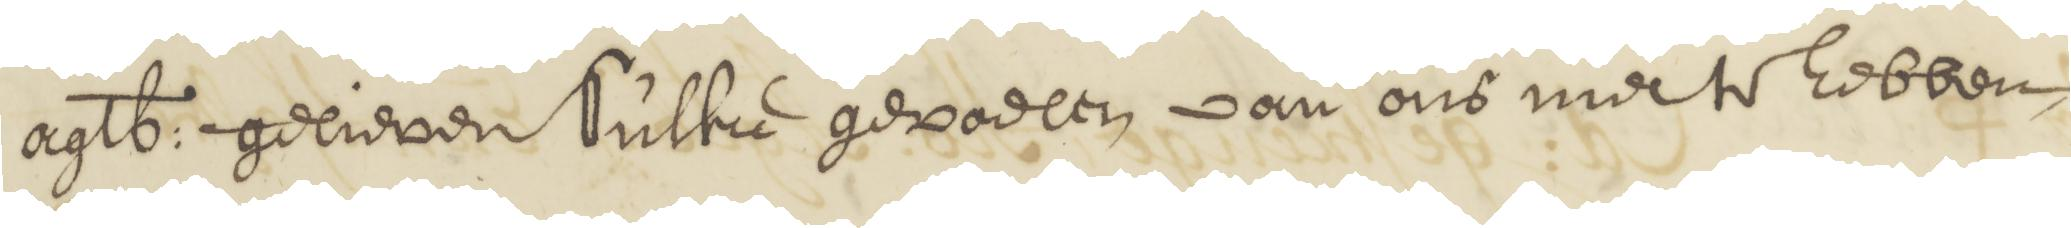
agtb: gelieven sulke gevoelen van ons niet te hebben,
